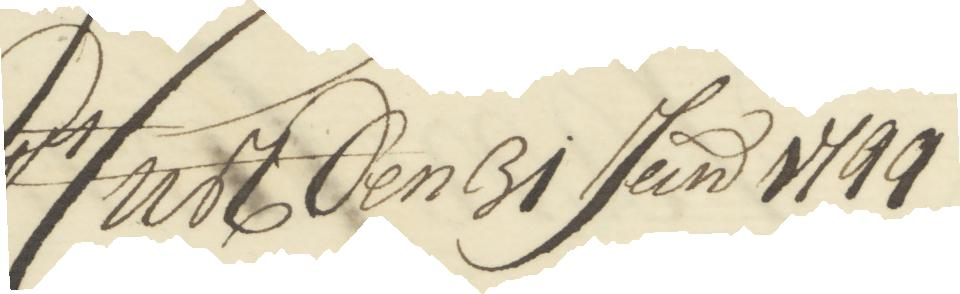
Wt Cust den 31 Jan 1744
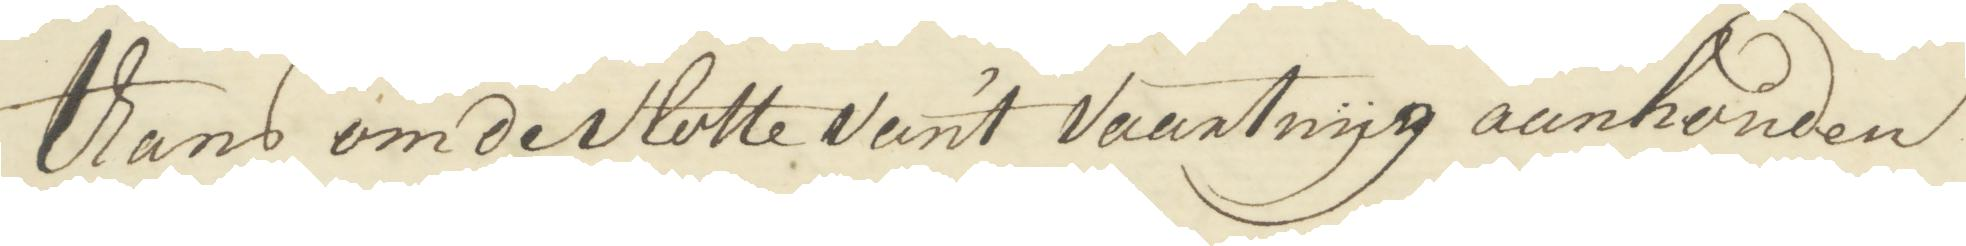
thans om de vlotte van’t vaartuijg aanhouden
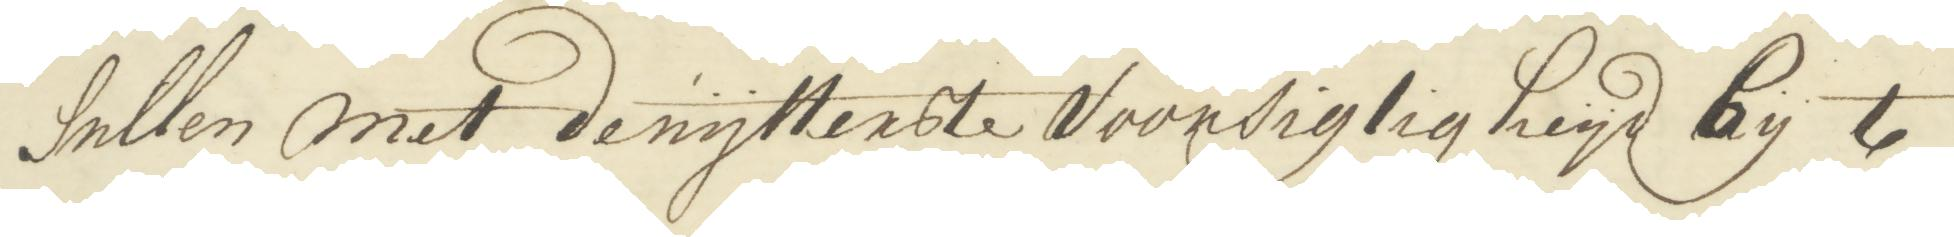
sullen met de uijtterste voorsigtigheijd bij t
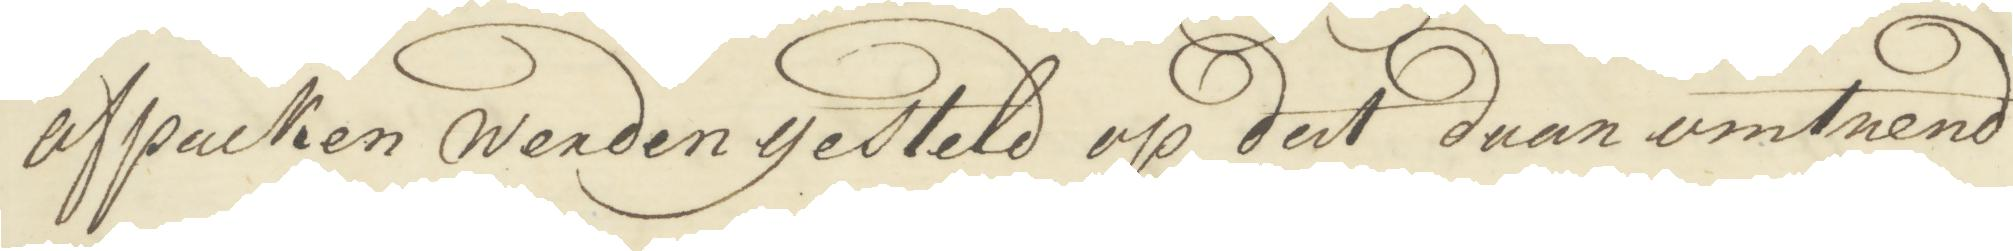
afpacken werden gesteld op dat daar omtrend
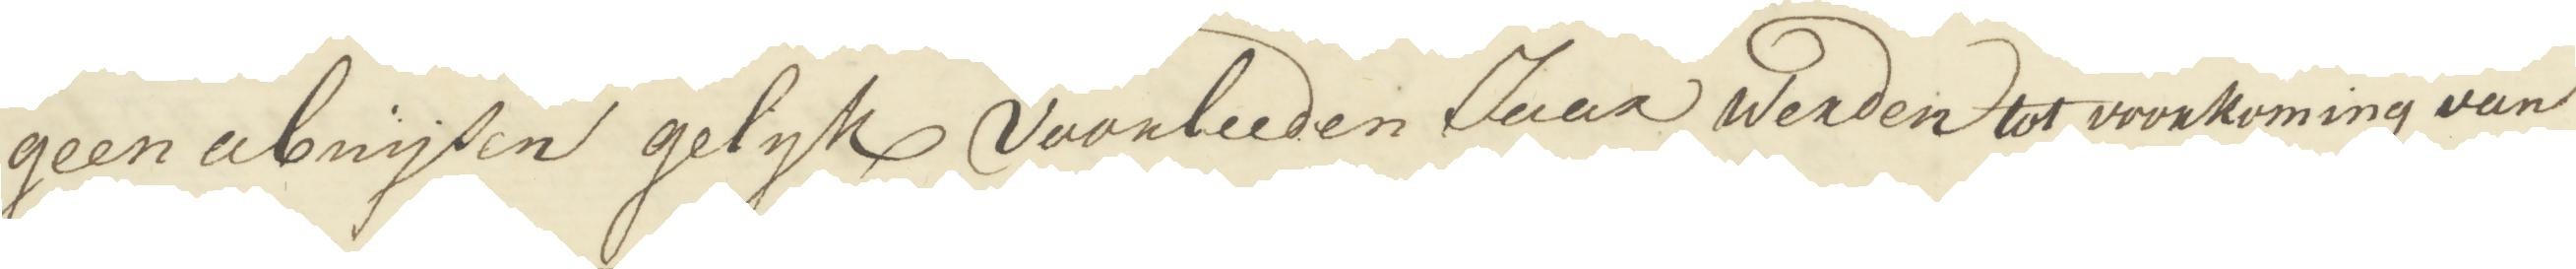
geen abuijsen gelyk voorleeden Jaar werden tot voorkoming van
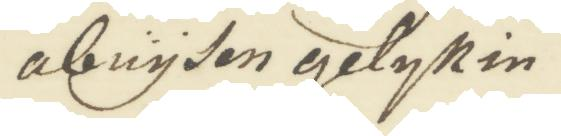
abuijsen gelyk in
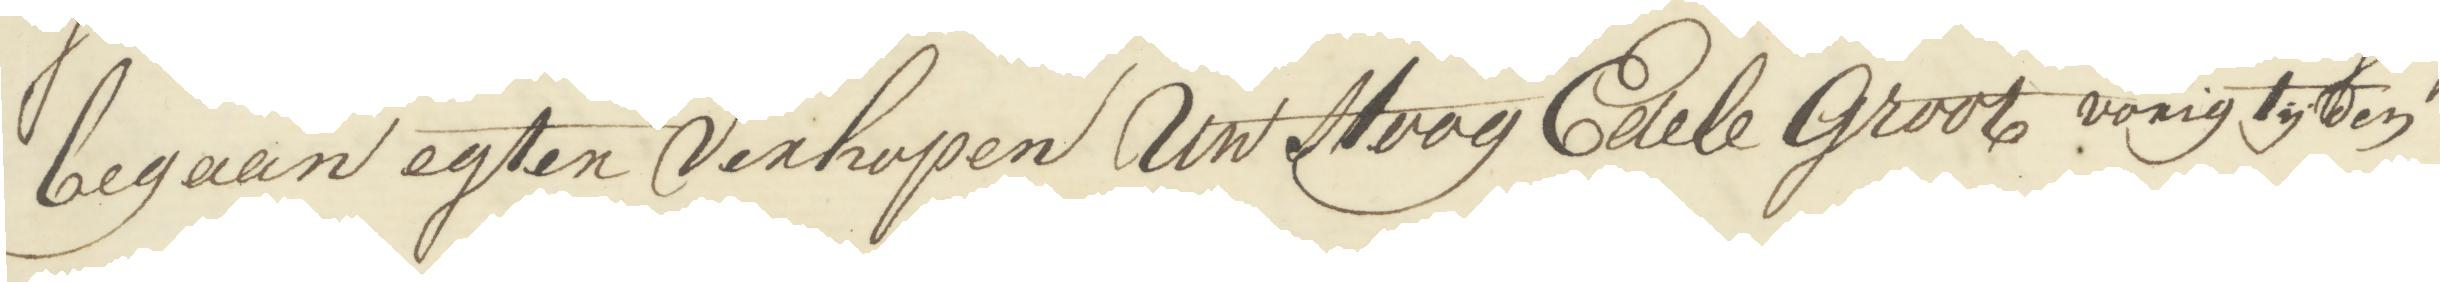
begaan egter verhopen uw Hoog Edele Groot vorig tijden
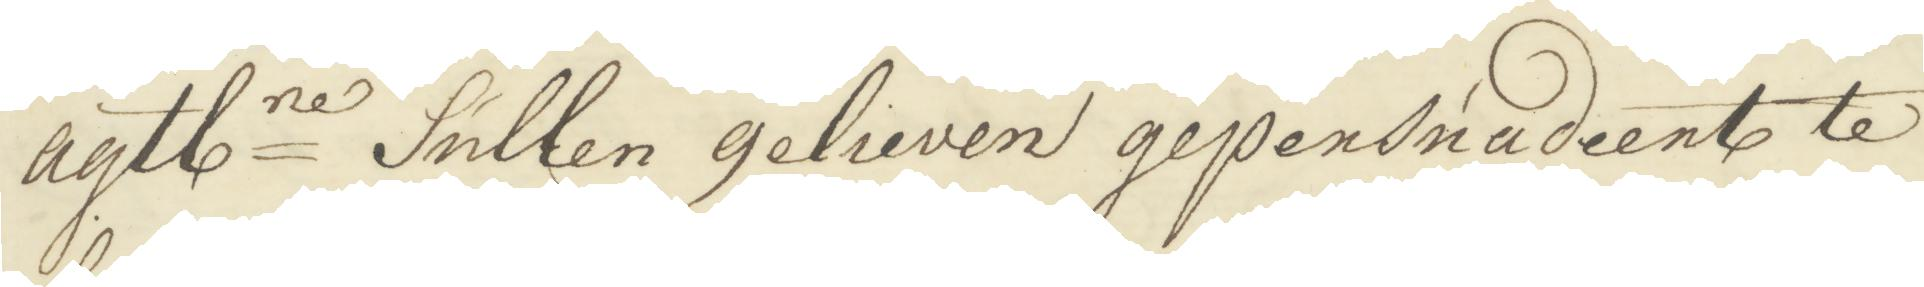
agtb=re sullen gelieven gepersuadeert te
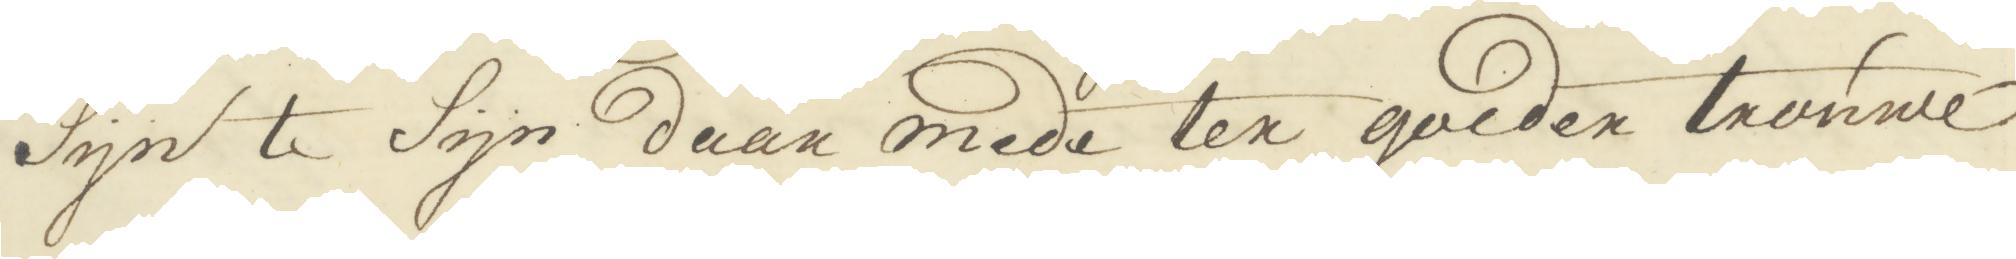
sijn te sijn daar mede ter goeder trouwe
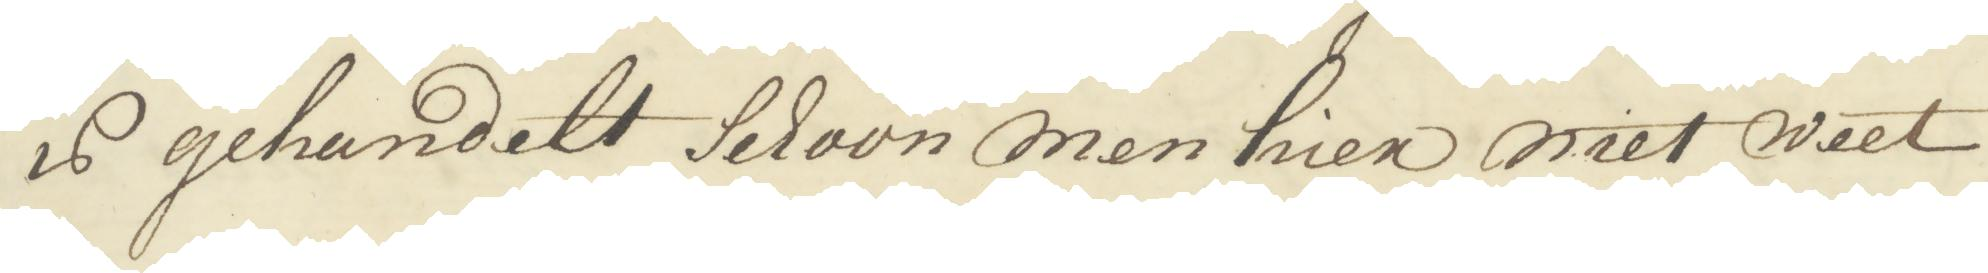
is gehandelt schoon men hier niet weet
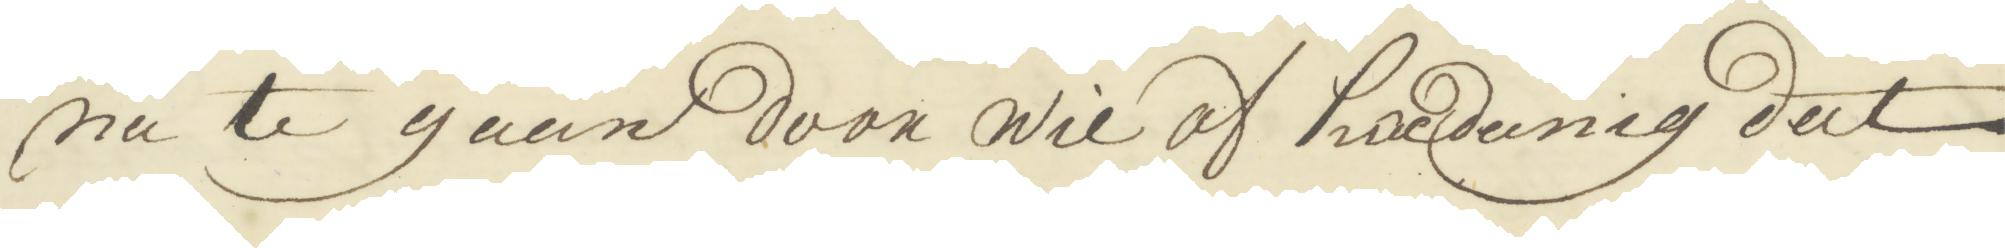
na te gaan door wie of hoedanig dat
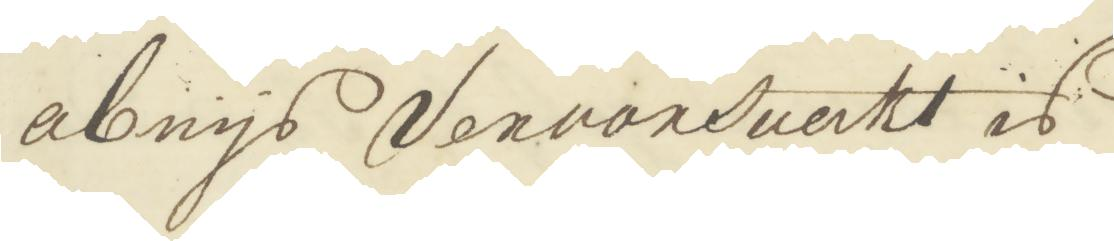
abuijs veroorsaakt is
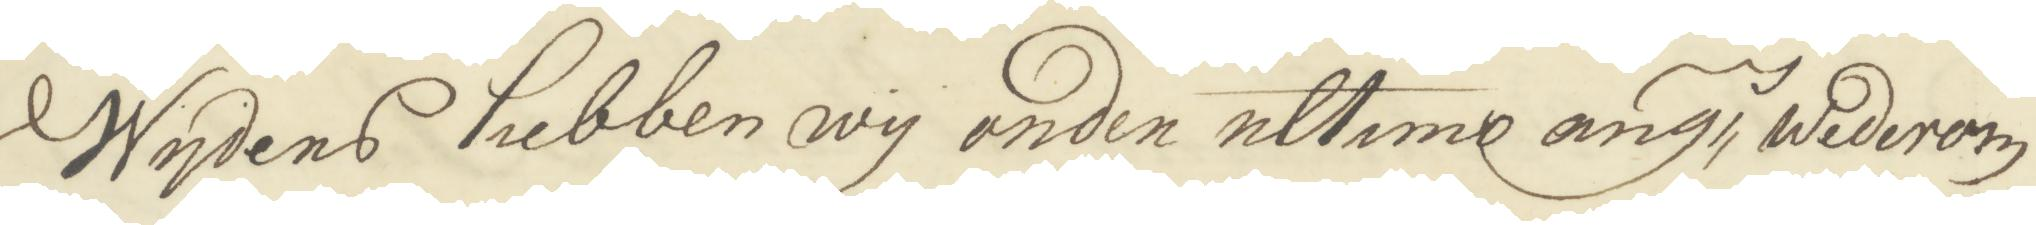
Wijdens hebben wij onder ultimo aug„s wederom
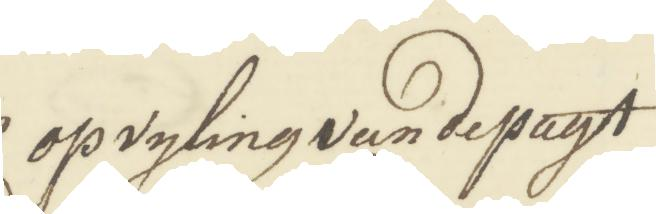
op vyling van de pagt
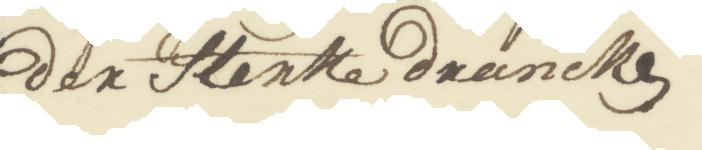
der sterke drancken
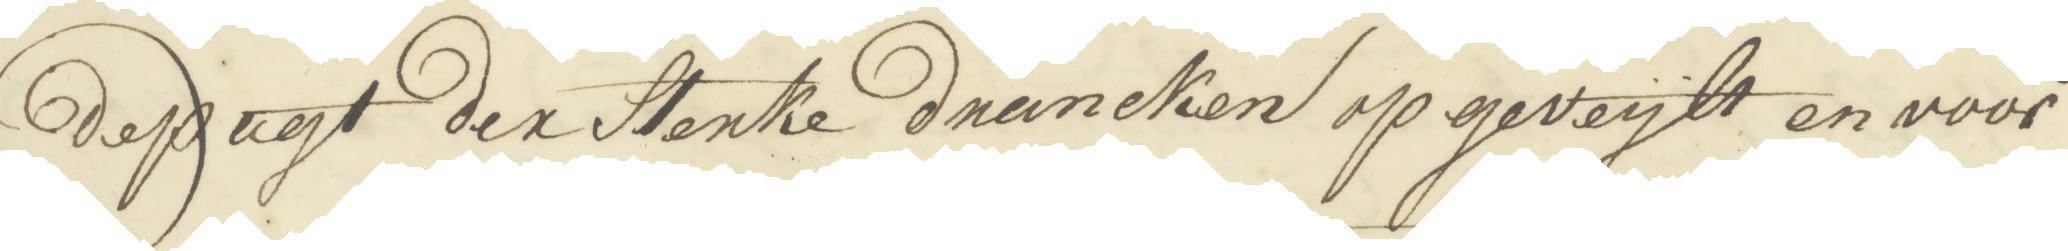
de pagt der sterke drancken op geveijlt en voor
